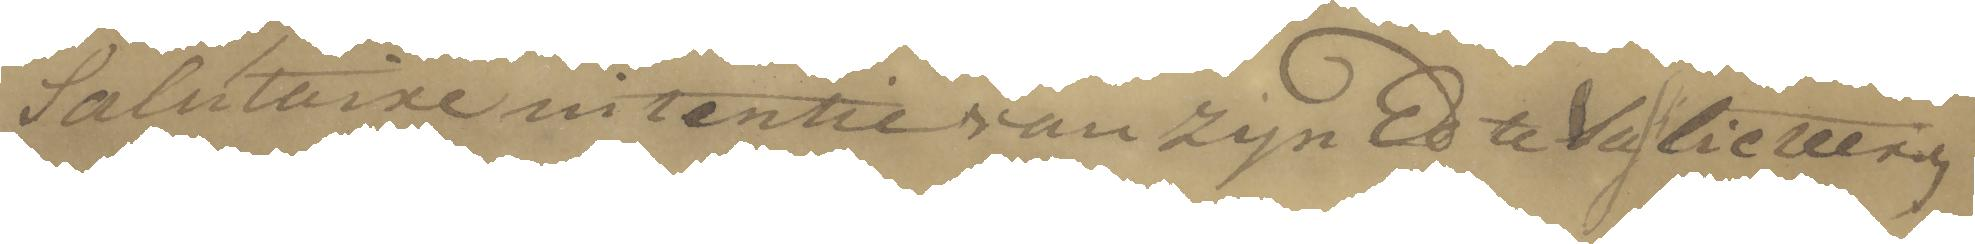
salutaire intentie van zijn Ed te vasilieteeren
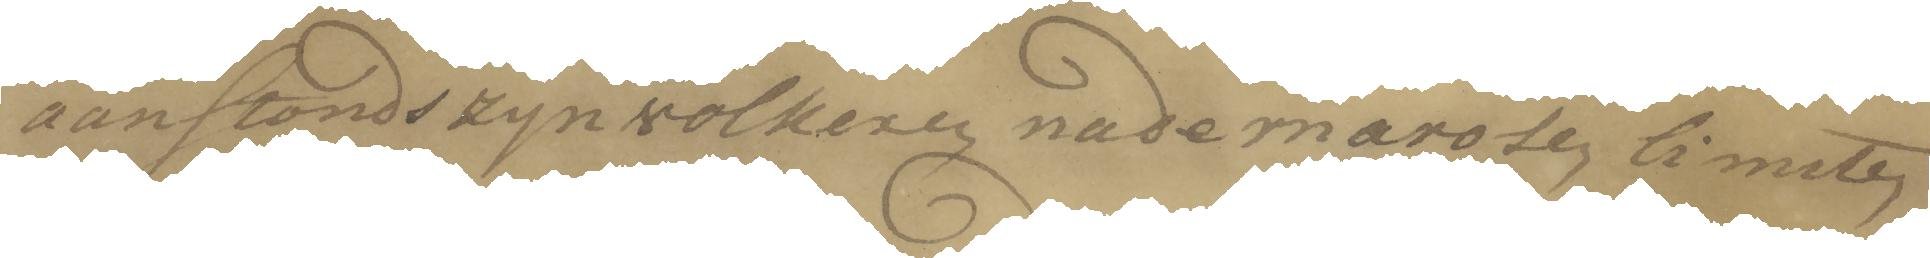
aanstonds zyn volkeren na de marosen limiten
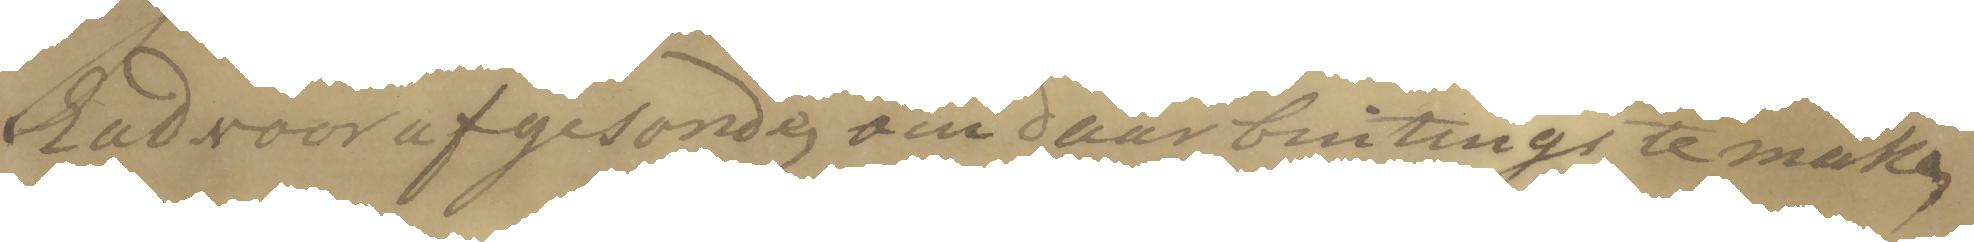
had voor afgesonden om daar bintings te maken
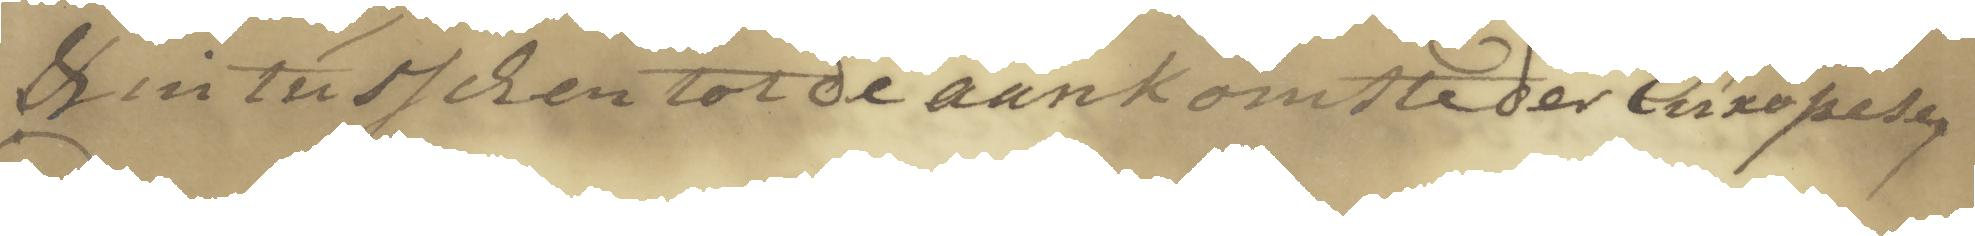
& in tusschen tot de aankomste der Europesen
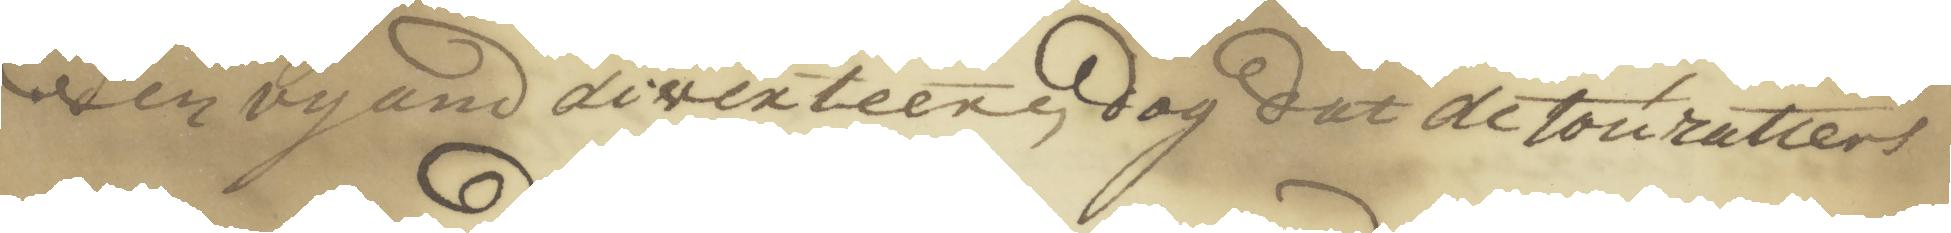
den vyand diverteeren dog dat de touratiers
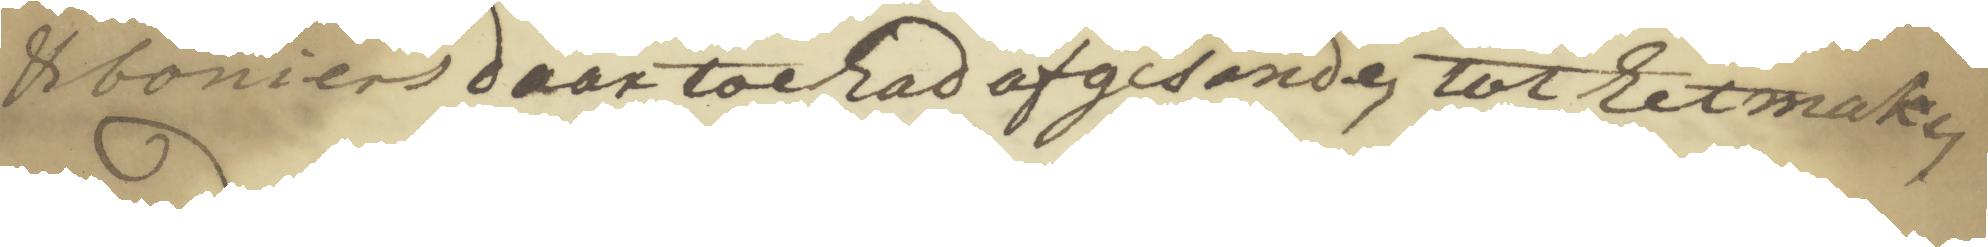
& boniers daar toe had afgesonden tot het maken
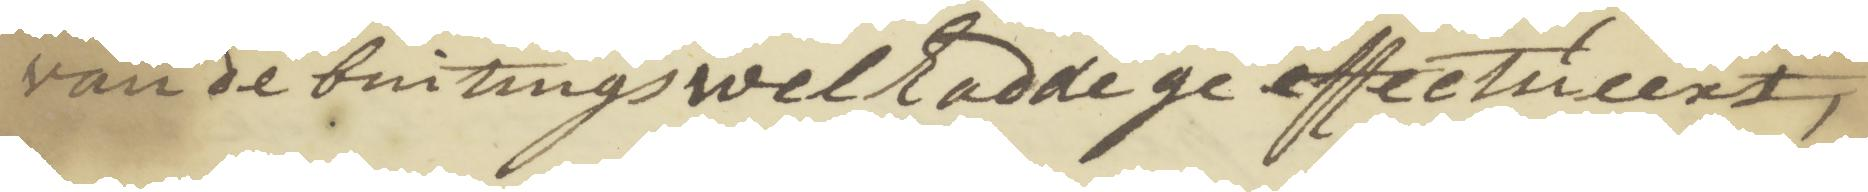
van de bintings wel hadde geeffectueert,
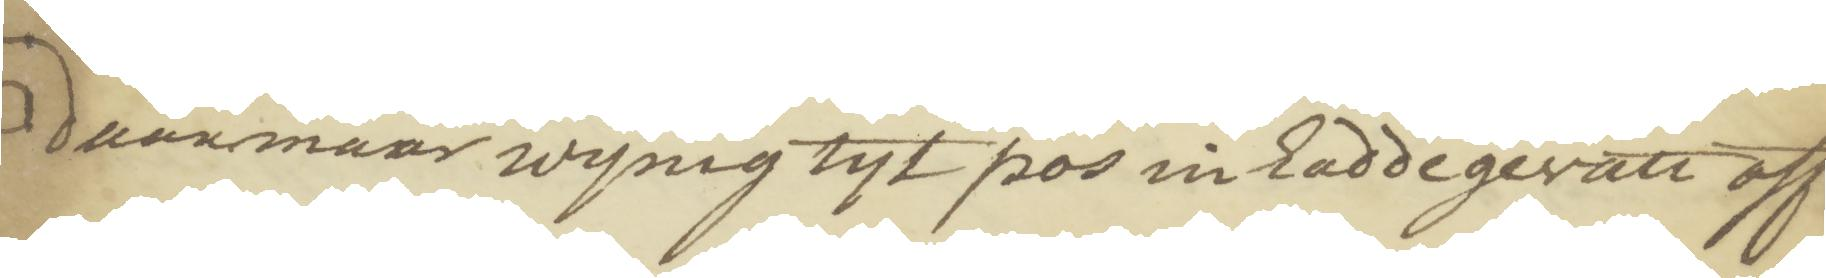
daar maar wynig tyt pos in hadde gevatt off
